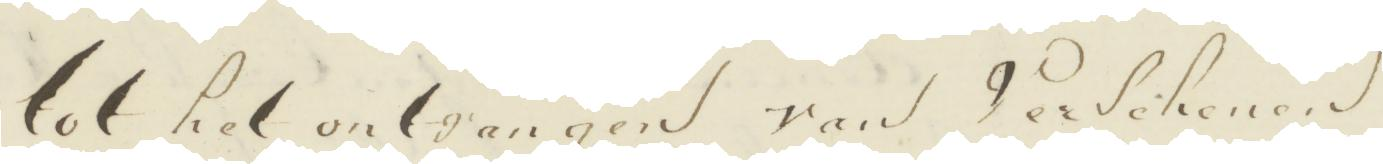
tot het ontvangen van Verschenen
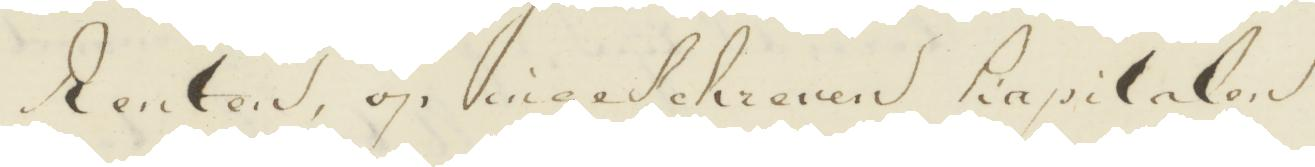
Renten, op ingeschreven Kapitalen
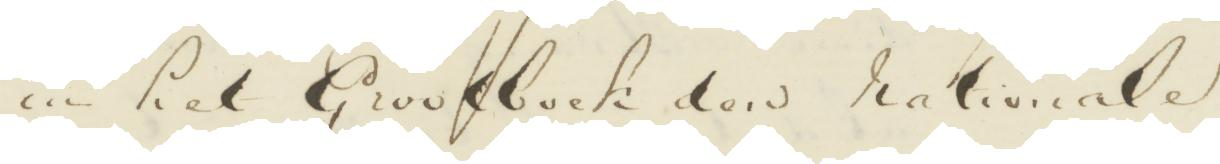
in het Grootboek der nationale
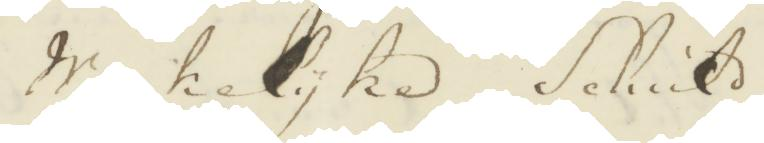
Werkelijke schuld
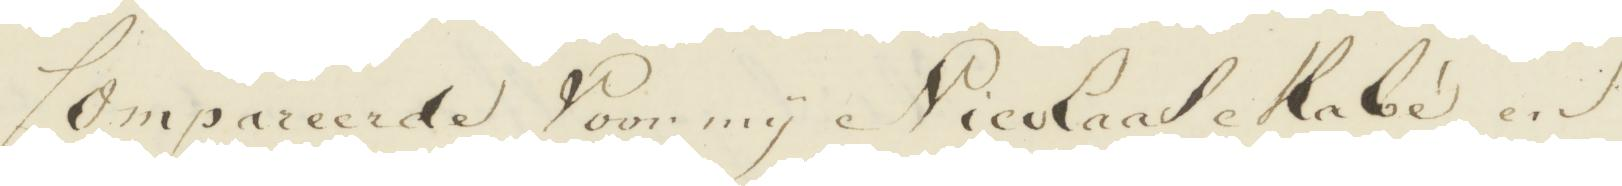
Compareerde Voor mij Nicolaas Mabé, en
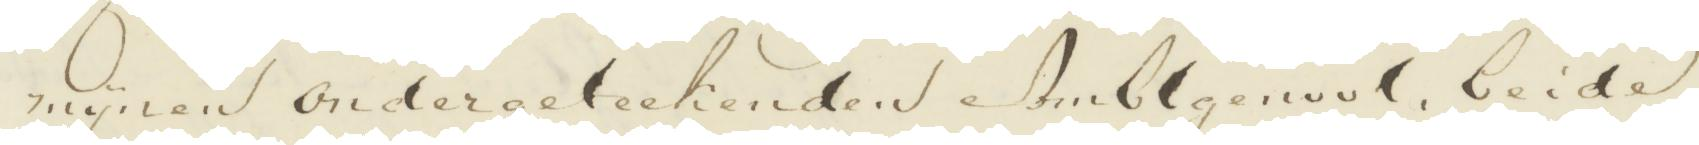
mijnen ondergeteekenden Ambtgenoot, beide
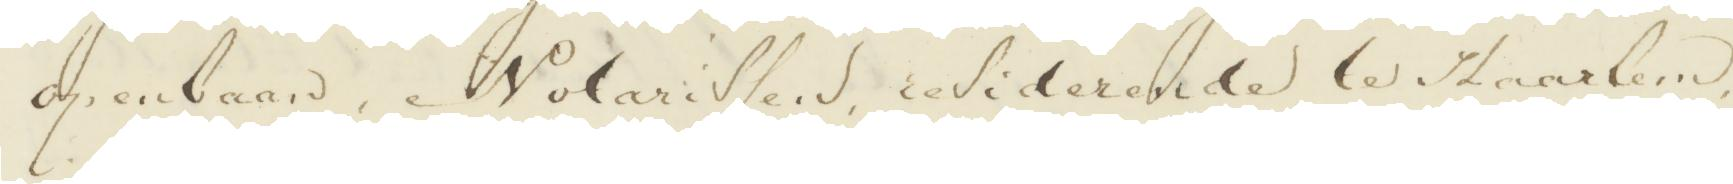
openbaar, Notarissen, residerende te Haarlem
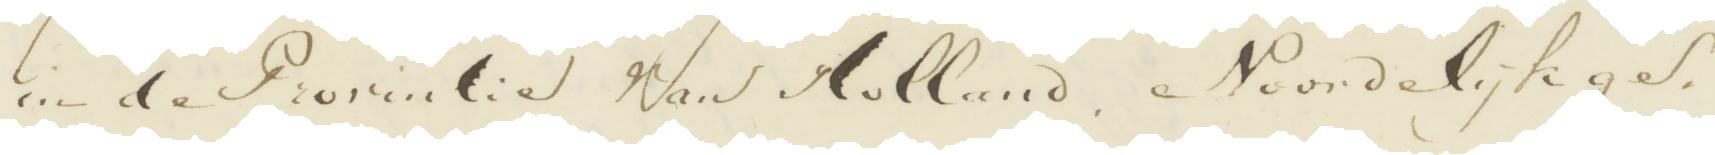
in de Provintie van Holland, Noordelijk ge„
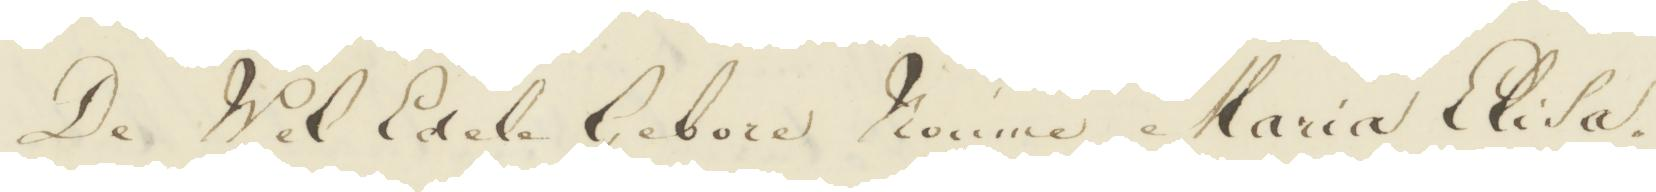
De Wel Edele Gebore Vrouwe Maria Elisa„
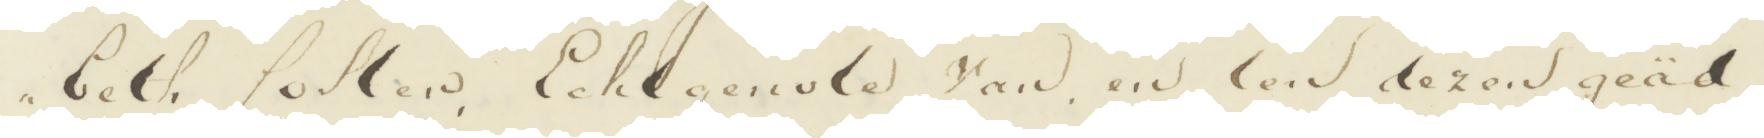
„beth Coster, Echtgenote van, en ten dezen geäd
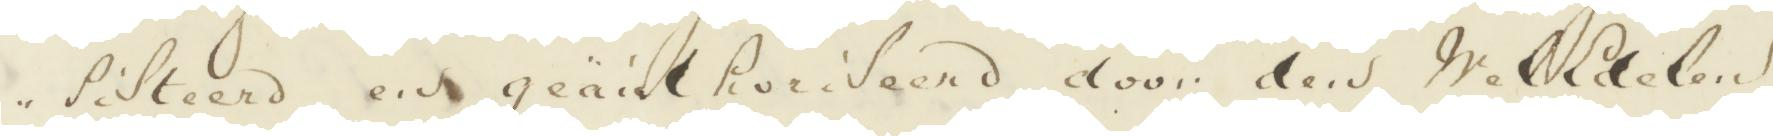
„sisteerd, en geäuthoriseerd door den Wel Edelen
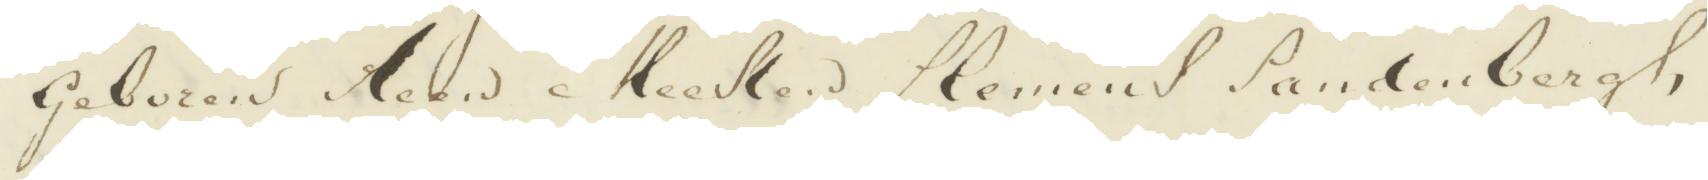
Geboren Heer Meester Clemens Sandenbergh
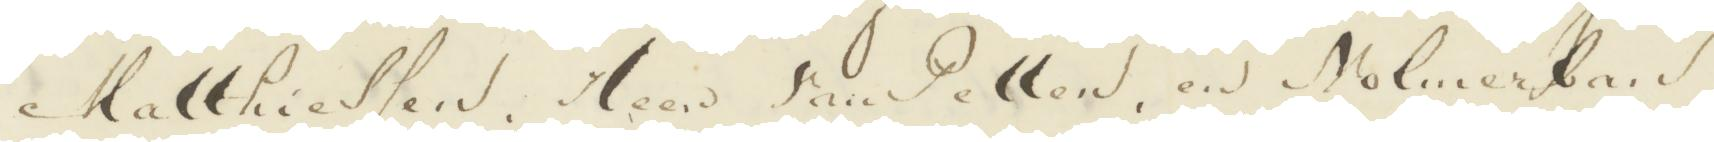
Matthiessen, Heer Van Petten, en Nolmerban
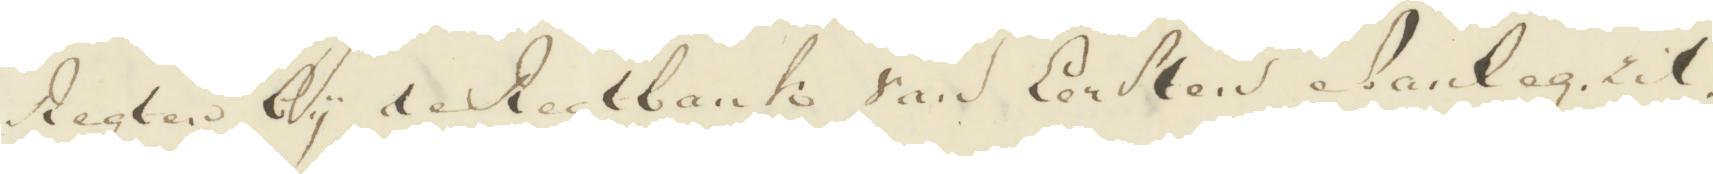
Regter bij de Regtbank van Eersten Aanleg. zit
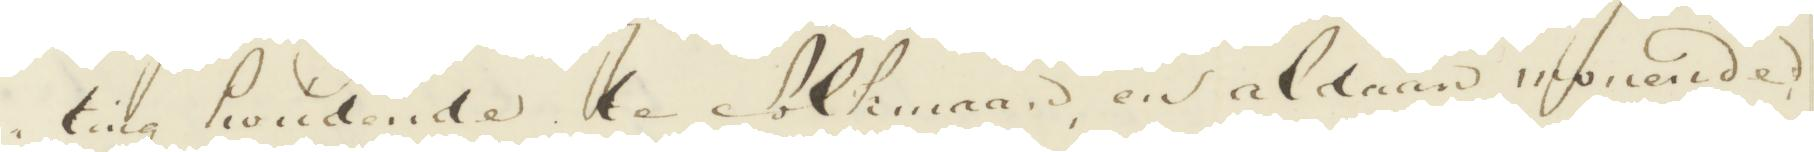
„ting houdende, te Alkmaar, en aldaar wonende,
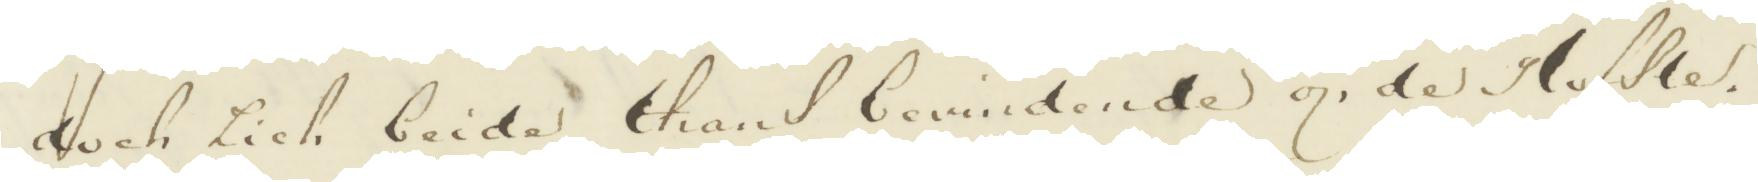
doch zich beide thans bevindende op de Hofste.
